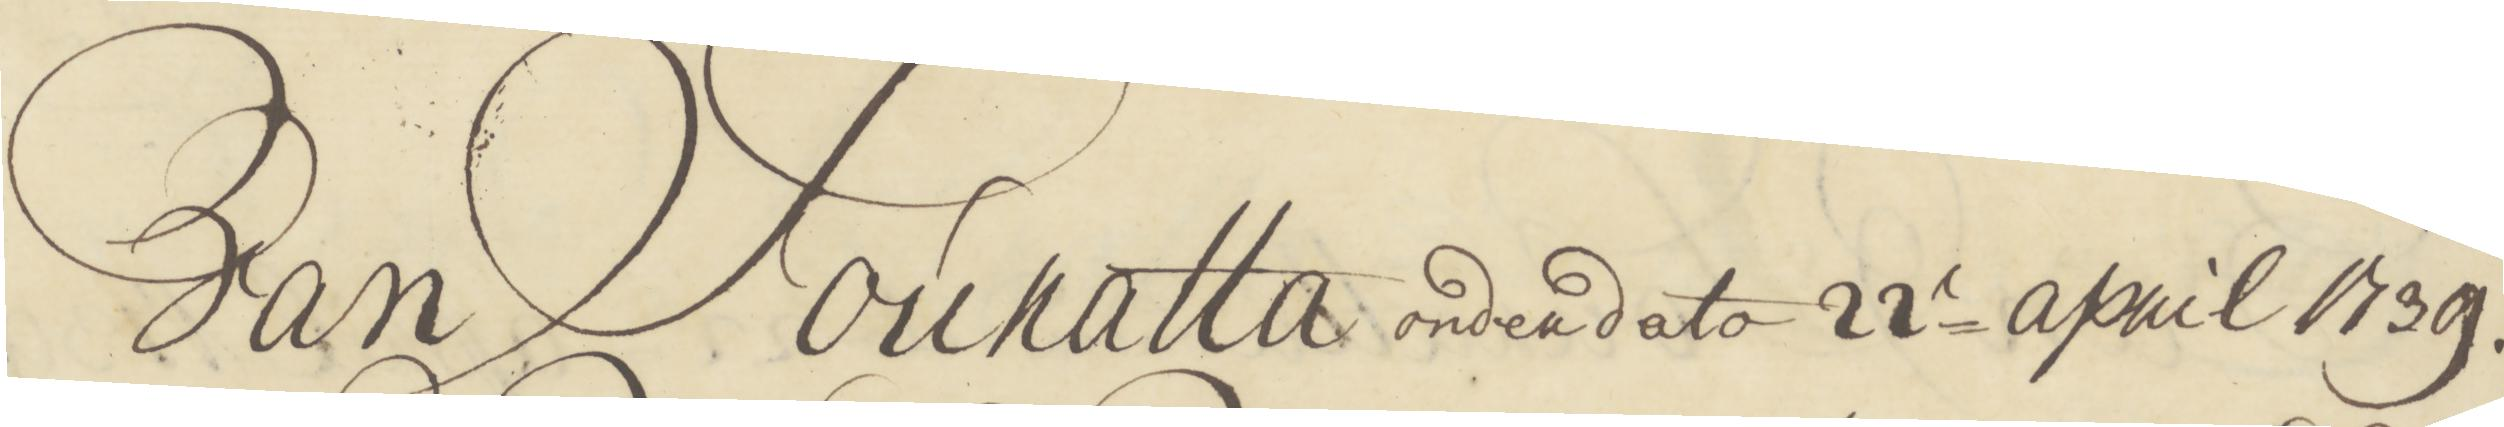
Van Souratta onder dato 22=e april 1739.
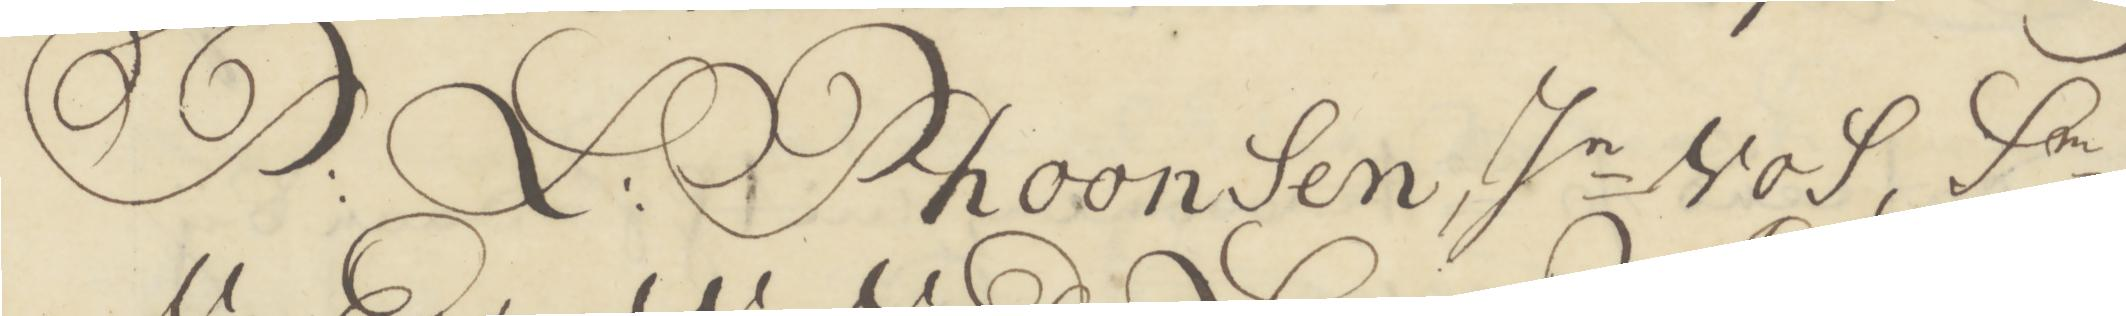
P: L: Phoonsen, J=n Vos, S=m
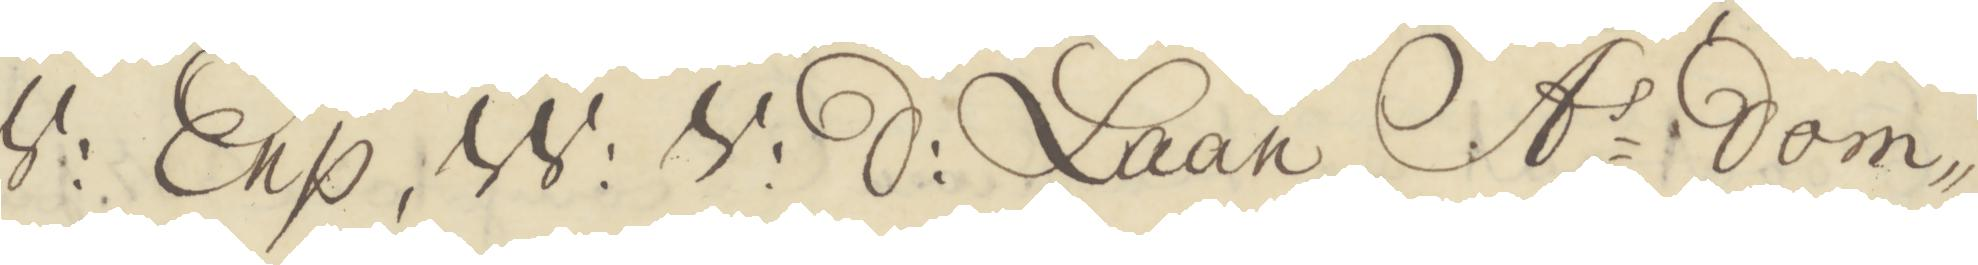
V: Erp, W: V: D: Laar, A=s Dom„
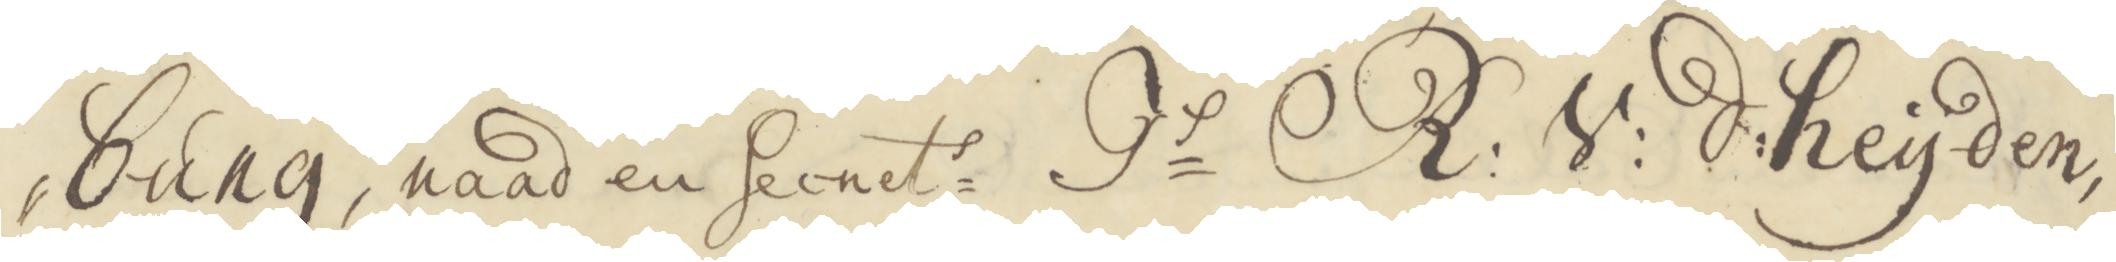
„burg, raad en secret=s I=s R: V: d: heijden,
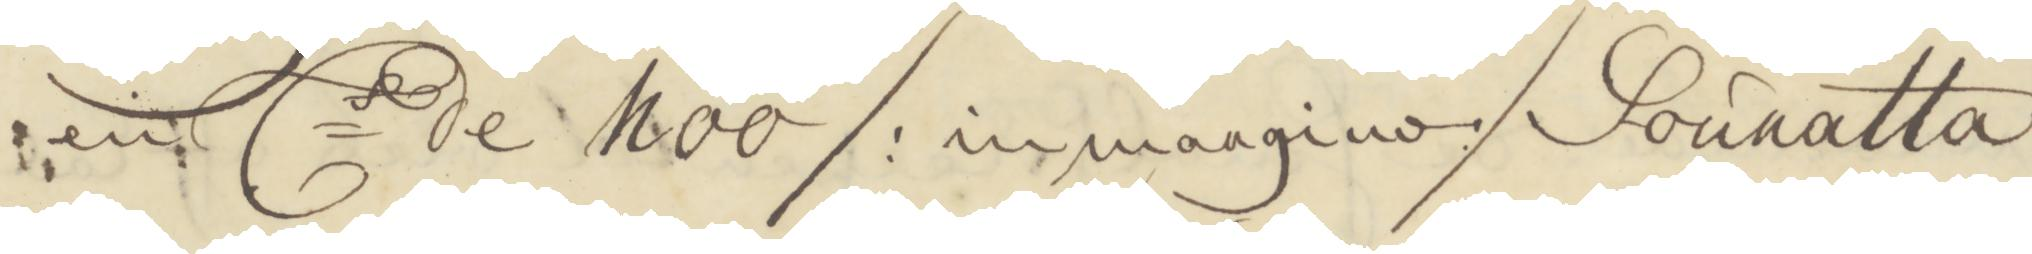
en C=f de Roo /: in margine :/ Souratta
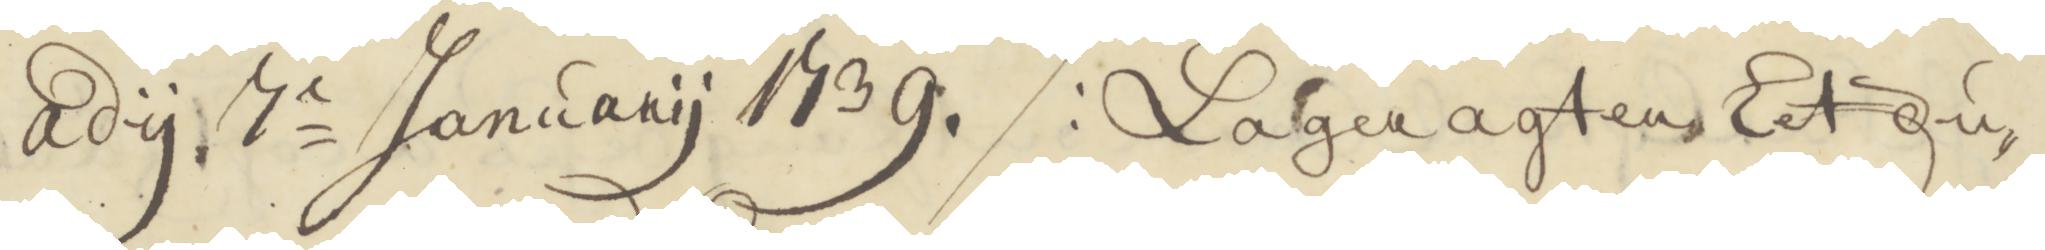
adij 7=e Januarij 1739. /:Lager agter het du„
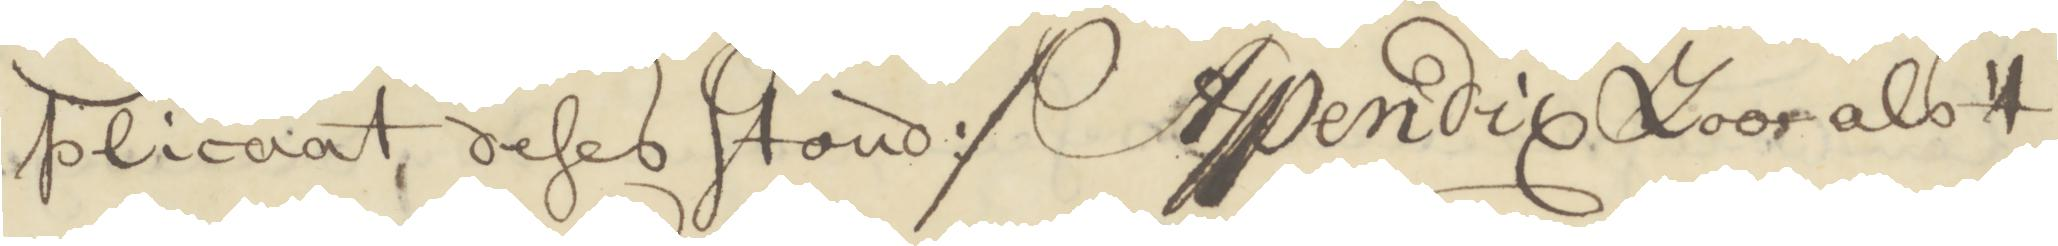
plicaat deses stond:/ Appendix zoo als 't
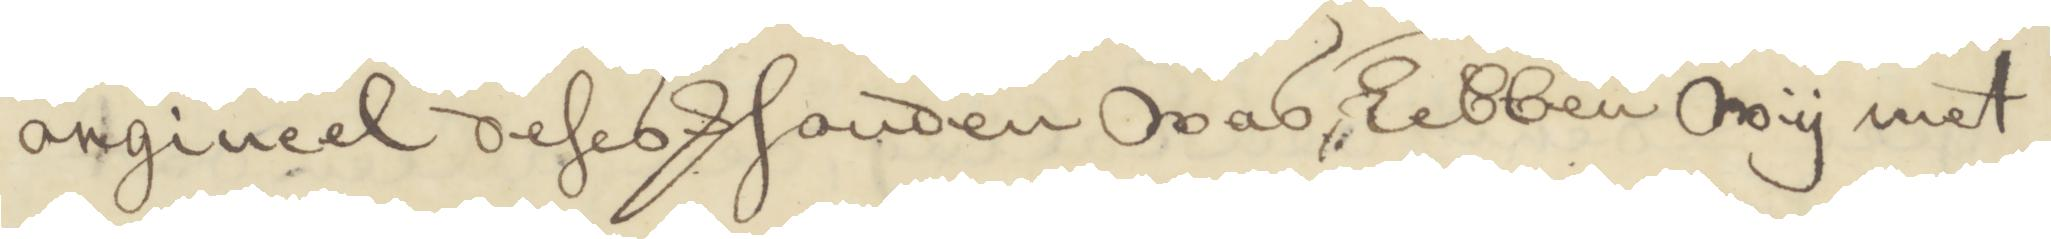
orgineel deses versonden was, hebben wij met
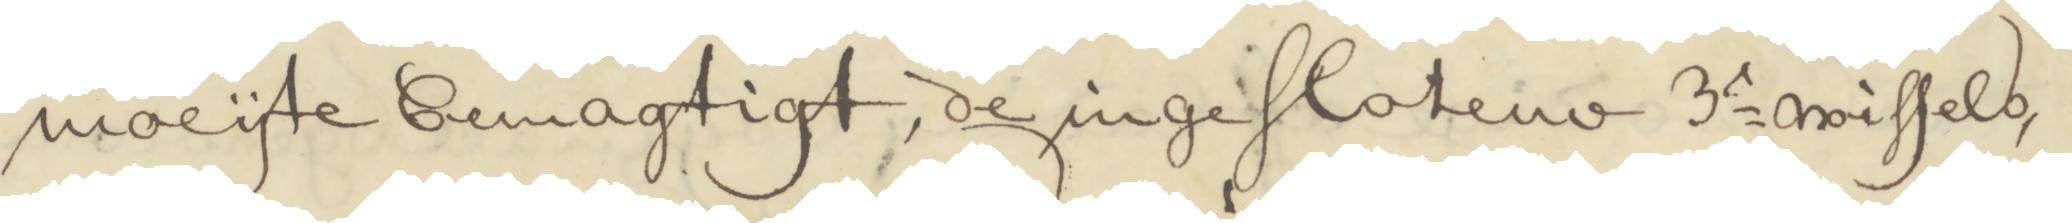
moeijte bemagtigt, de ingeslotene 3=e wissels,
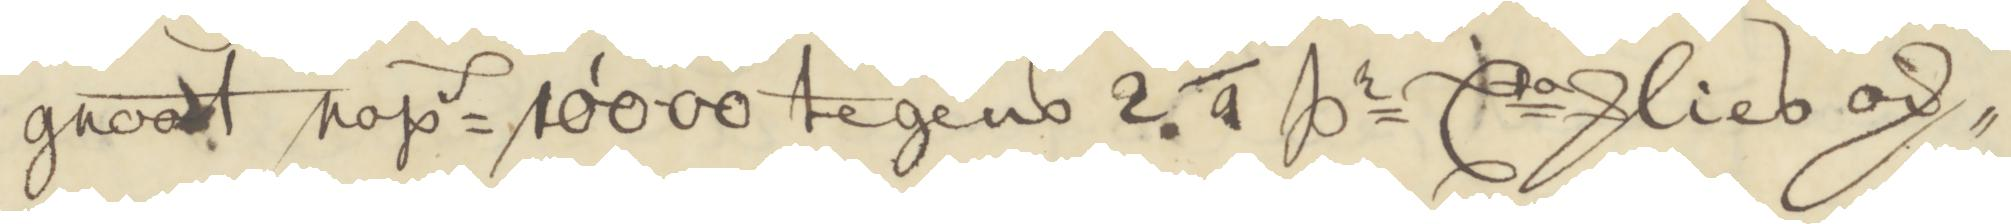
groot rop=s 10'000 tegens 2¼ P=r C=to verlies over„
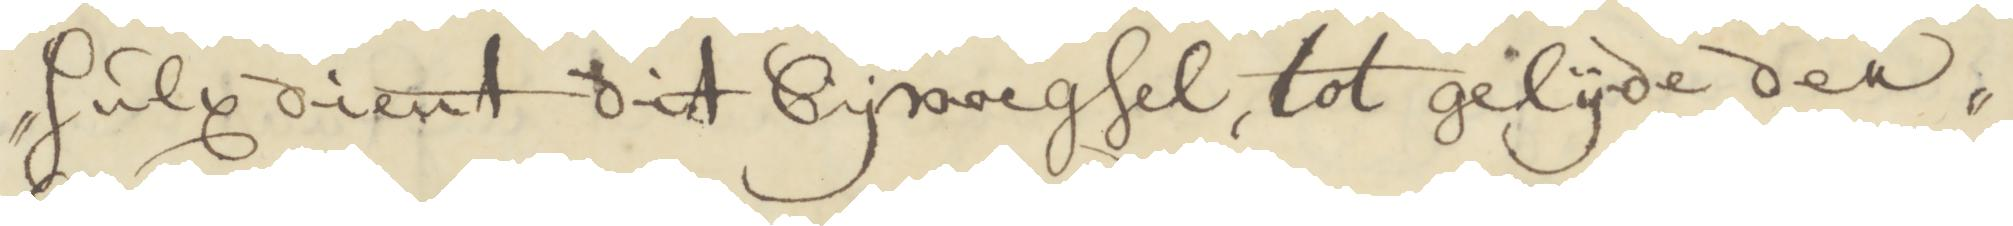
„sulx dient dit bijvoegsel, tot gelijde der„
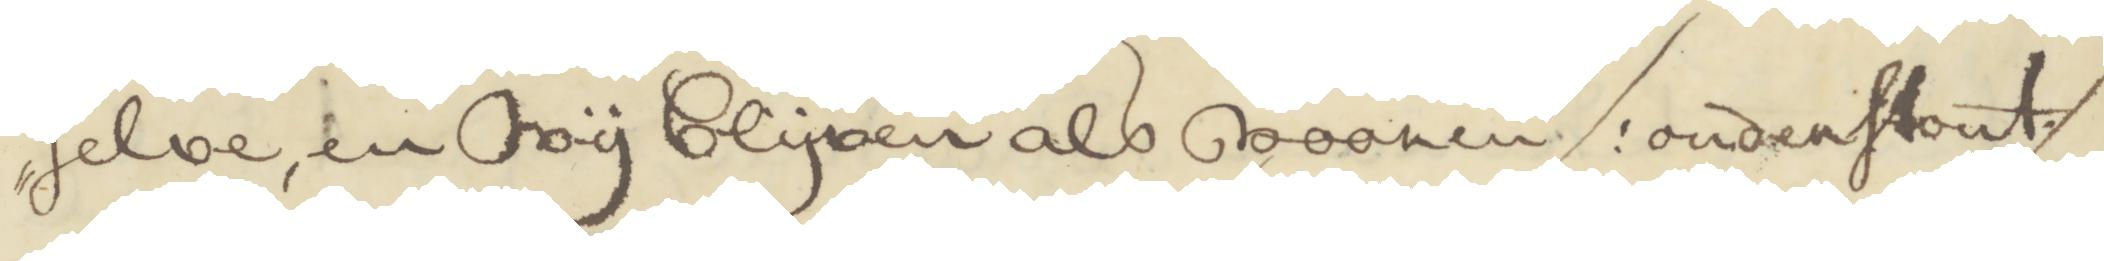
„selve, en wij blijven als vooren /:onderstont:/
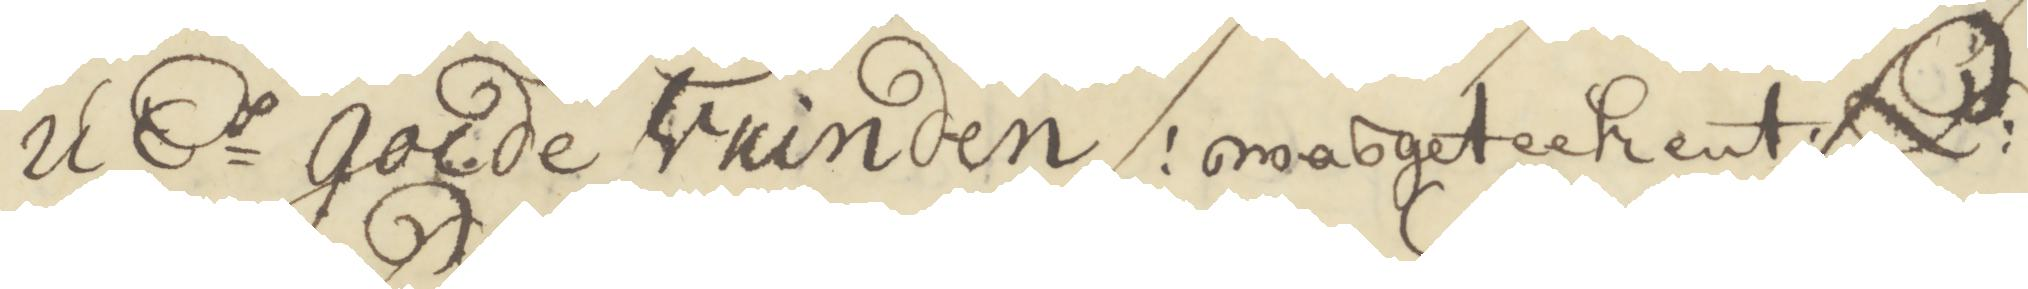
u E=s goede Vrinden /:was geteekent:/ L:
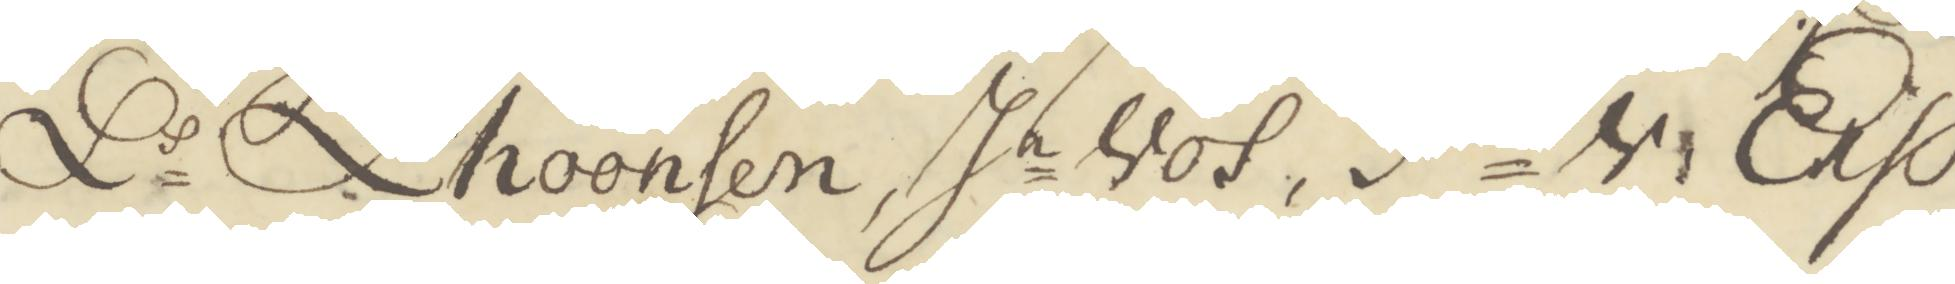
L=s Phoonsen, J=n Vos, S=m V: Erp
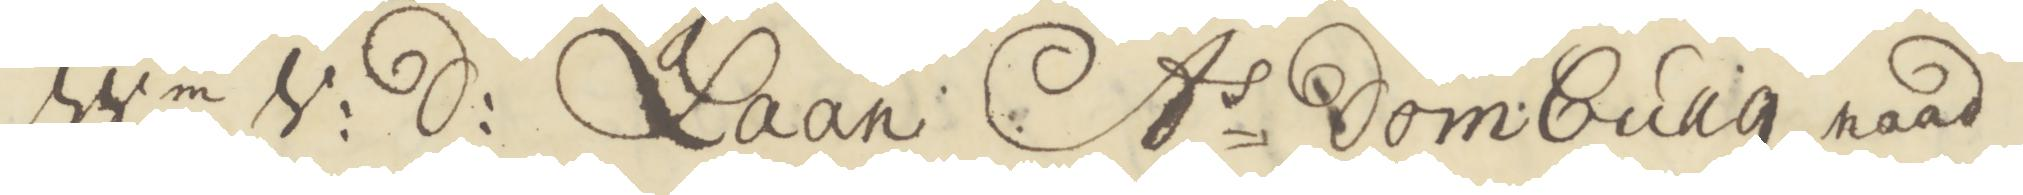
W=m V: D: Laar A=s Domburg, raad
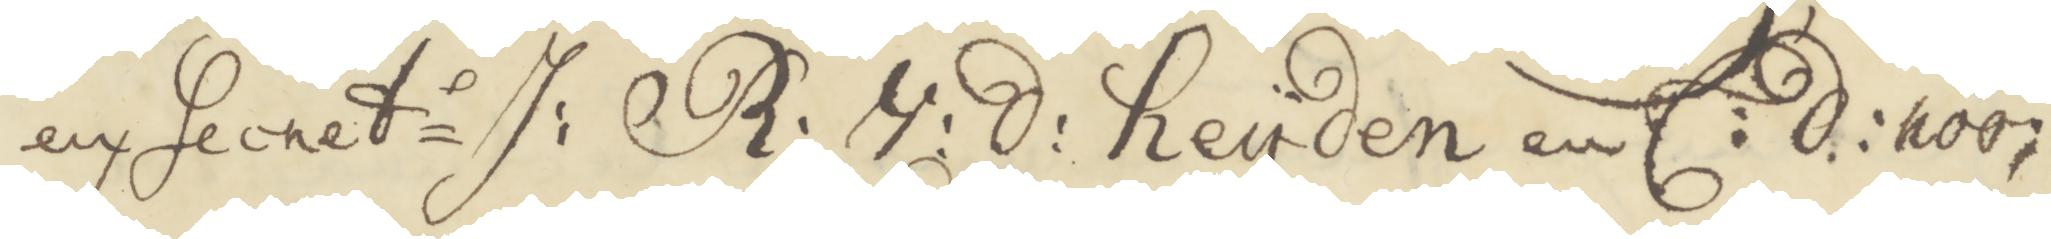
en secret=s J: R: v: d: heijden en C: d: roo;
